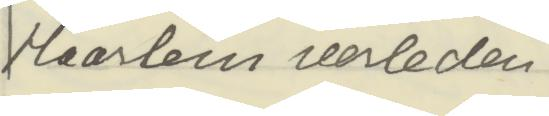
Haarlem verleden
